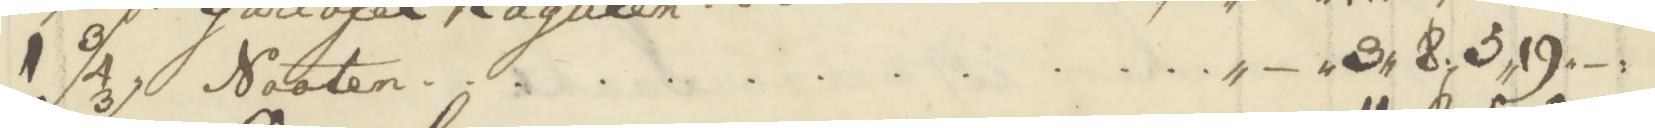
1 ¾ „ Nooten . . . . . . . . . . . . . „ —„ 3„ 8„ 3„ 19„ — :
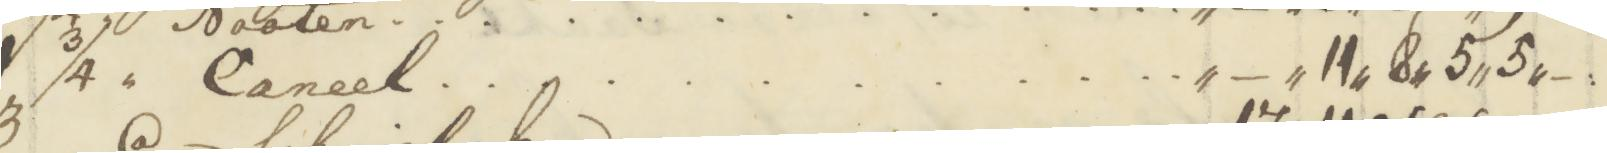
1 ¾ „ Caneel . . . . . . . . . . . . „ —„ 11„ 8„ 5„ 5„ —:
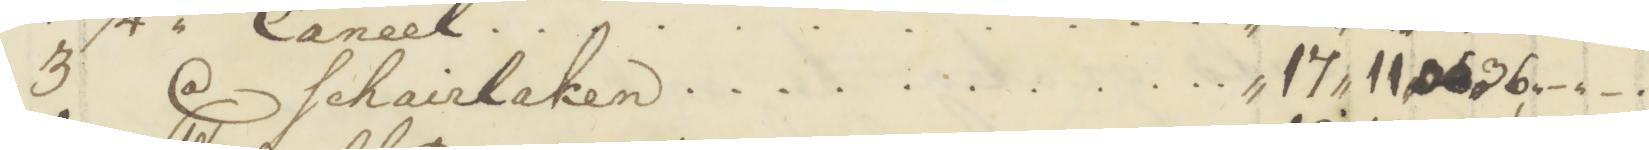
3 @ schairlaken . . . . . . . . . . . „ 17„ 11„ 36„ 36„ —„ —
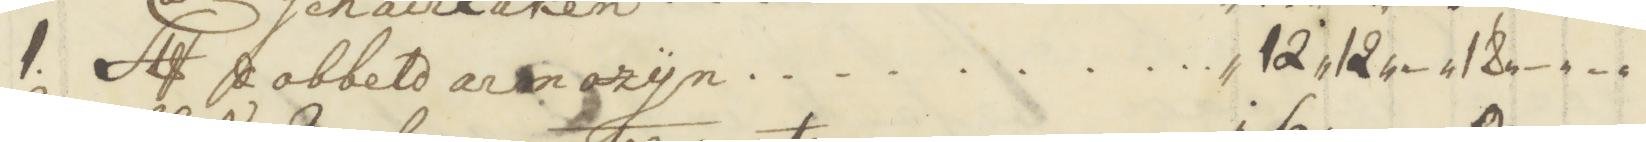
1. stver dobbeld armozijn . - - - . . . . . . „ 12„ 12„ —„ 18„ —„ —„
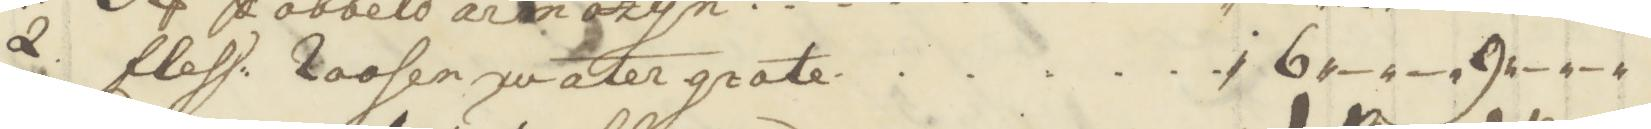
2. fless: roosen water grote . . . . . . . „ 6„ —„ —„ 9„ —„ —„
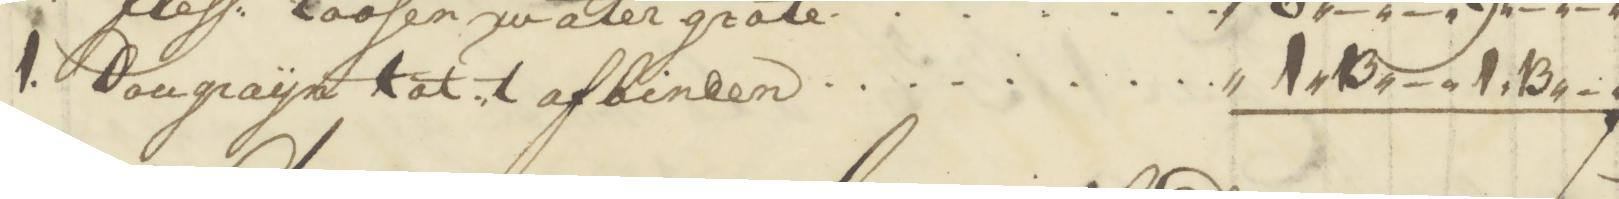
1. dougraijn tot „t afbinden . . . - . . . . . „ 1„ 13„ —„ 1„ 13„ —„
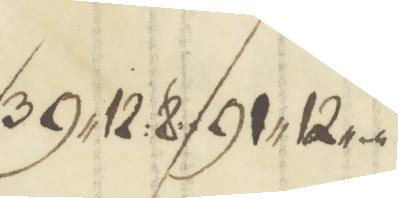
ƒ 39„ 12: 8: ƒ 91„ 12„ —„
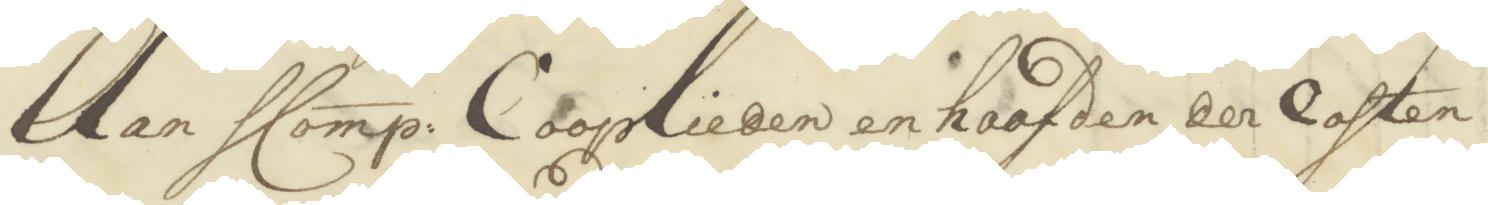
Aan sComp: Cooplieden en hoofden der Casten
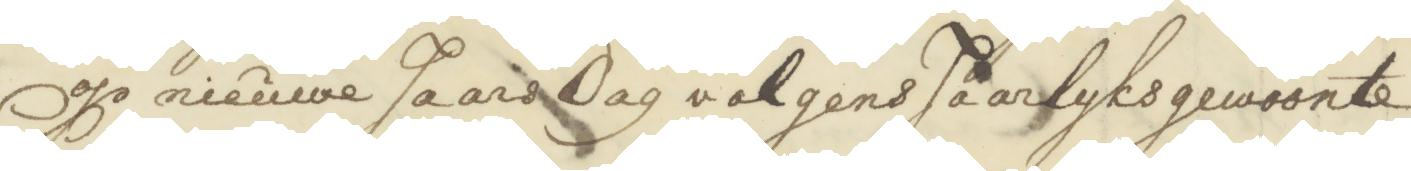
op nieuwe Jaars dag volgens Jaarlyks gewoonte
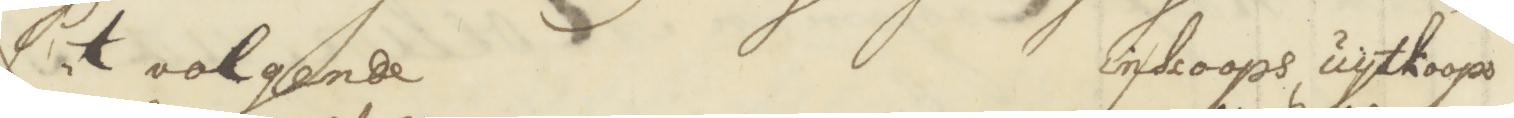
„'t volgende inkoops uijtkoops
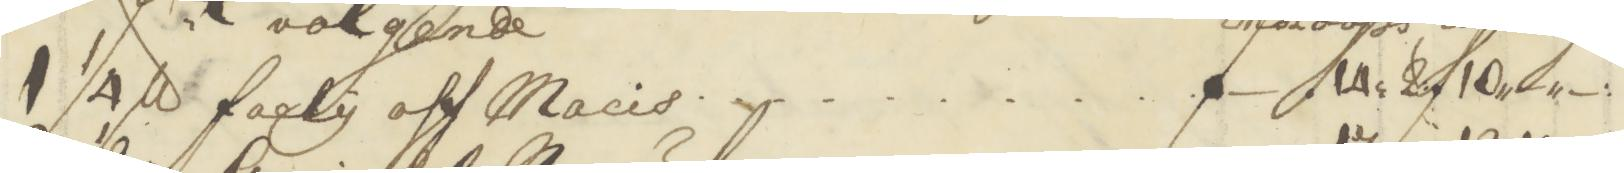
1 ¼ lb foelij off Macis . . - - - . . . . . ƒ —„ 14„ 8„ ƒ 10„ —„ —:
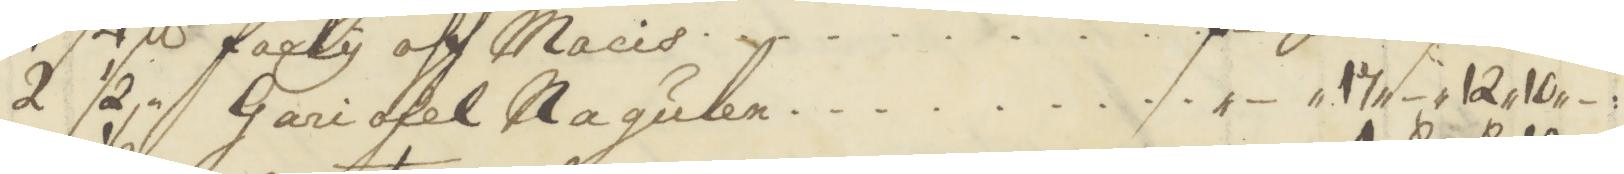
2 ½ „ Gariofel Nagulen . - - . . - . . . „ —„ 17„ —„ 12„ 10„ —
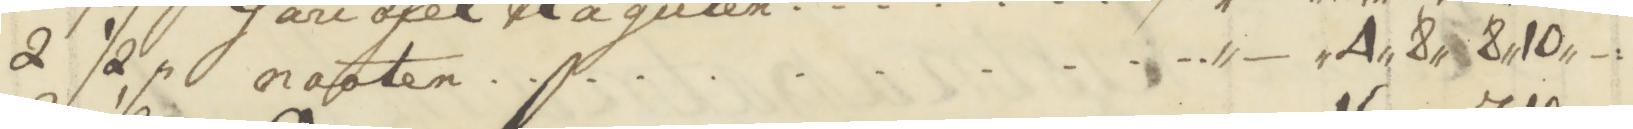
2 ½ „ nooten . . . . . . . . - - - - „ —„ 4„ 8„ 8„ 10„ —
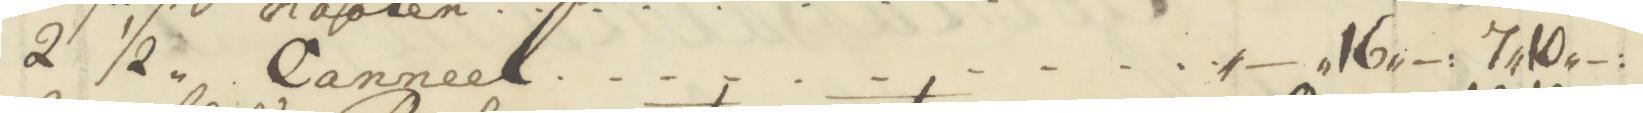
2 ½ „ Canneel . - - - . - - - - . . „ —„ 16„ —: 7„ 10„ —:
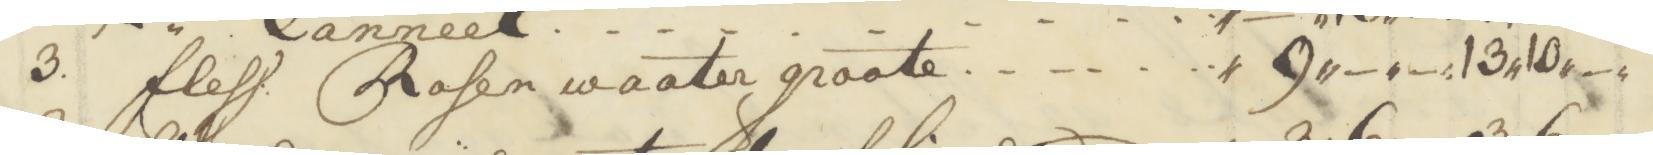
3. fless: Rosen waater groote . - - - . . . „ 9„ —„ —„ 13„ 10„ —„
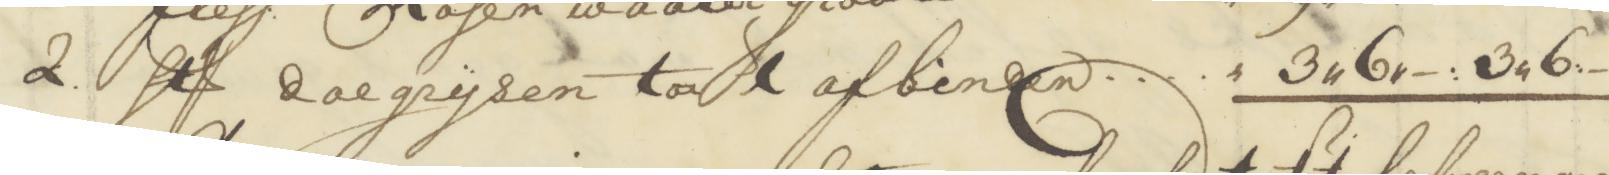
2. stver doegrijsen toe 't afbinden . . . . „ 3„ 6„ —: 3„ 6: —
